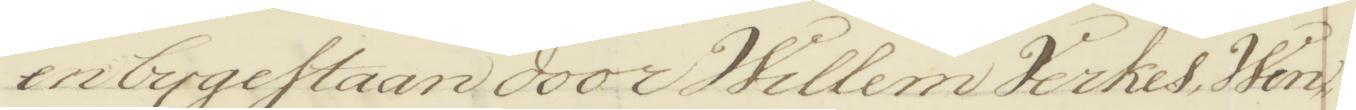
en bijgestaan door Willem Verkes, Win„
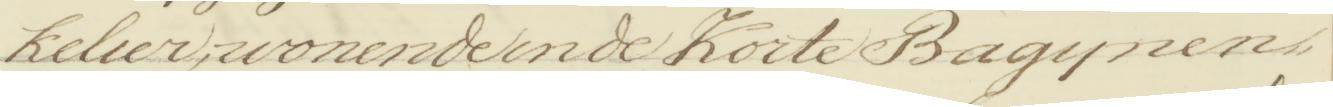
kelier, wonende in de Korte Bagynen
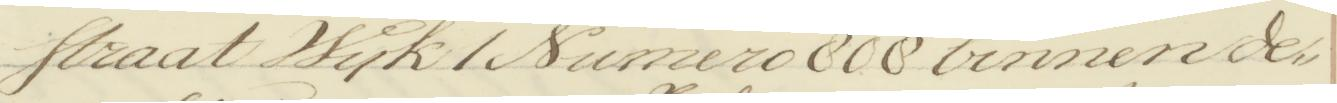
straat Wyk 1 Numero 808 binnen de„
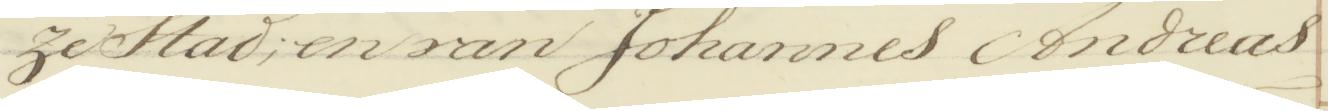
ze stad; en van Johannes Andreas
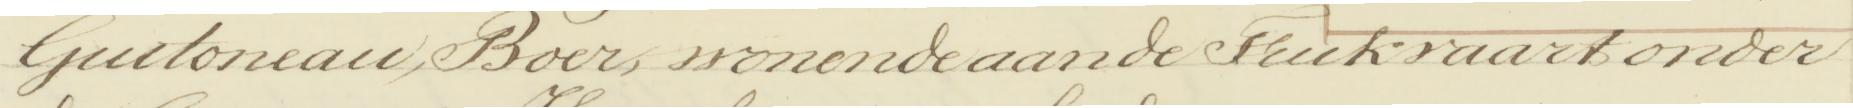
Guitoneau, Boer, wonende aan de Fuikvaart onder
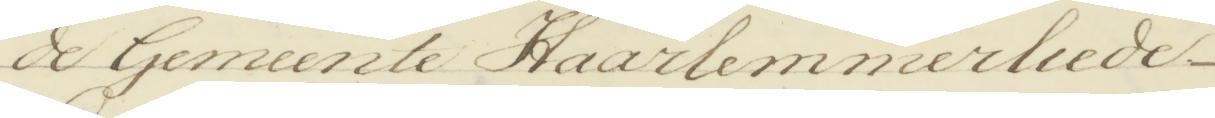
de Gemeente Haarlemmerliede-
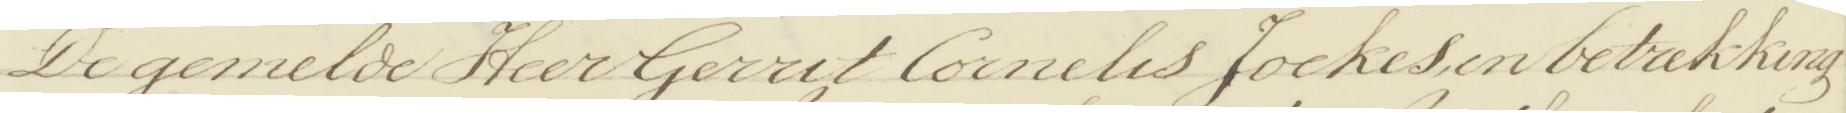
De gemelde Heer Gerrit Cornelis Joekes, en betrekking
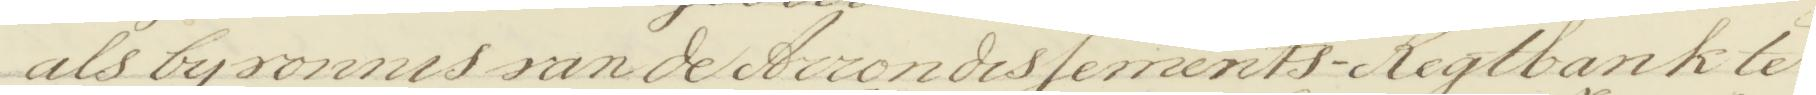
als by vonnis van de Arrondissements-Regtbank te
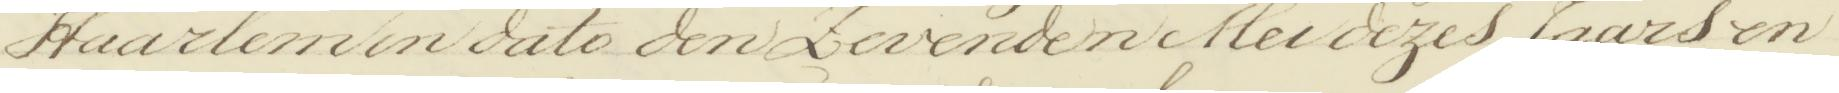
Haarlem in dato den Zevenden Mei dezes Jaars en
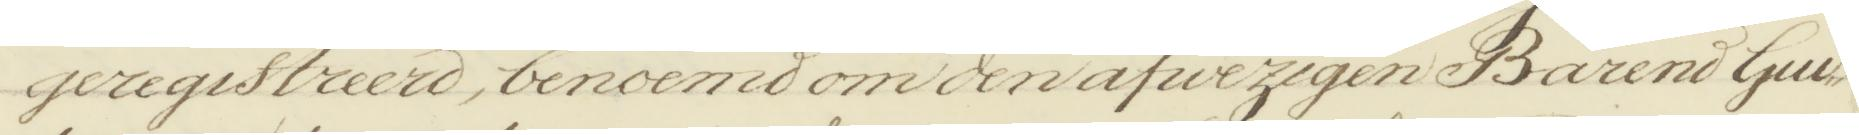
geregistreerd, benoemd om den afwezigen Barend Gui„
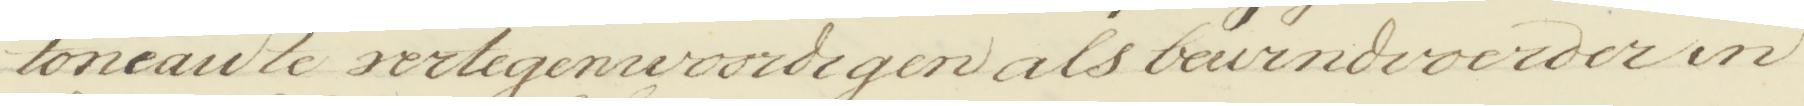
toneau te vertegenwoordigen als bewindvoerder in
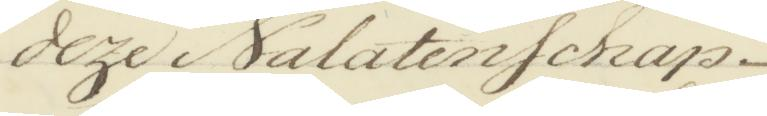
deze Nalatenschap.-
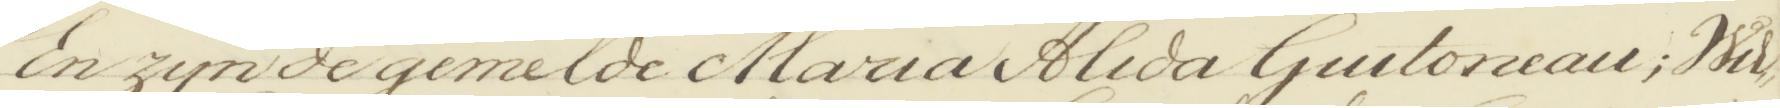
En zyn de gemelde Maria Alida Guitoneau; Wil,
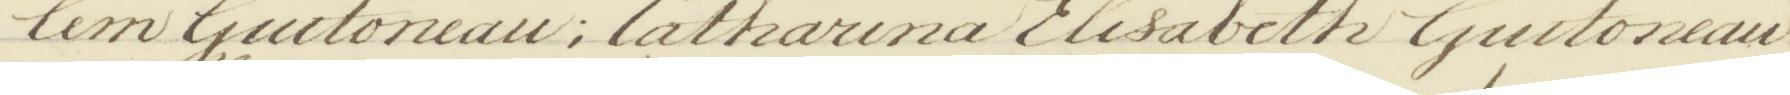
lem Guitoneau, Catharina Elisabeth Guitoneau
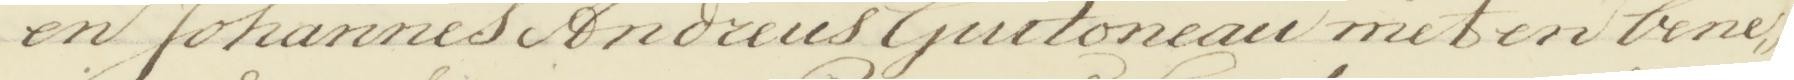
en Johannes Andreus Guitoneau met en bene„
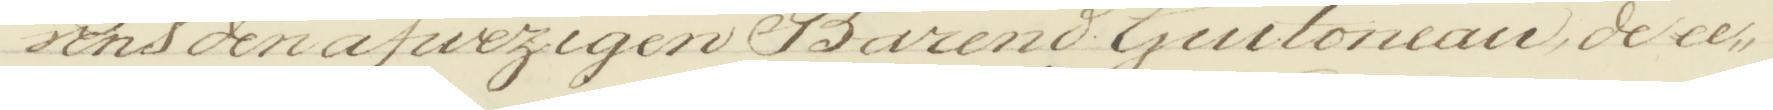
vens den afwezigen Barend Guitoneau, de ee„
